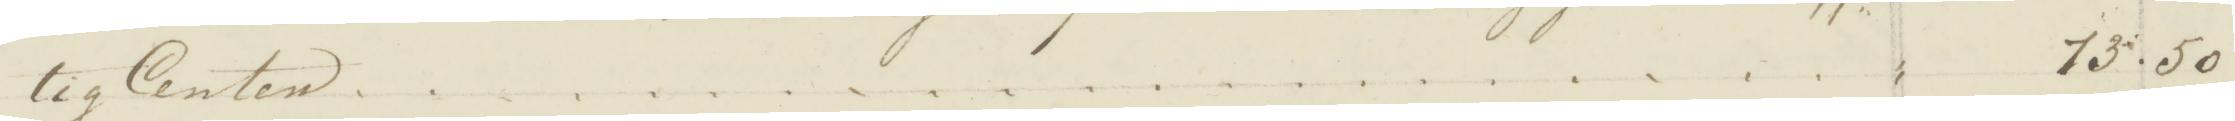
tig Centen - - - - - - - - - - - - - - - - - - - - - - „ 73 .50
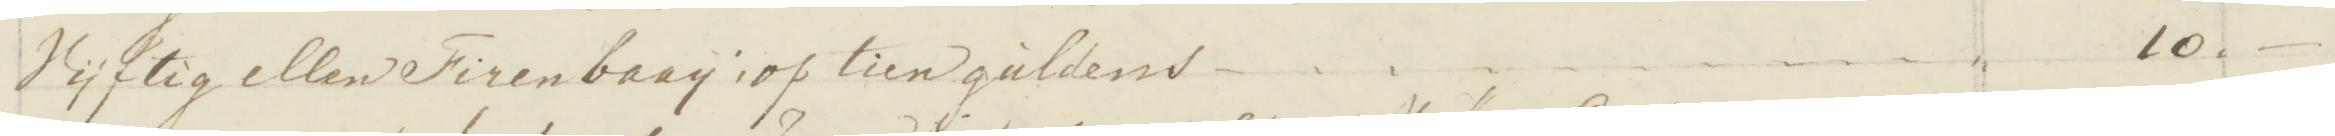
Vijftig ellen Firenbaaij, op tien guldens - - - - - - - - - - „ 10 , —
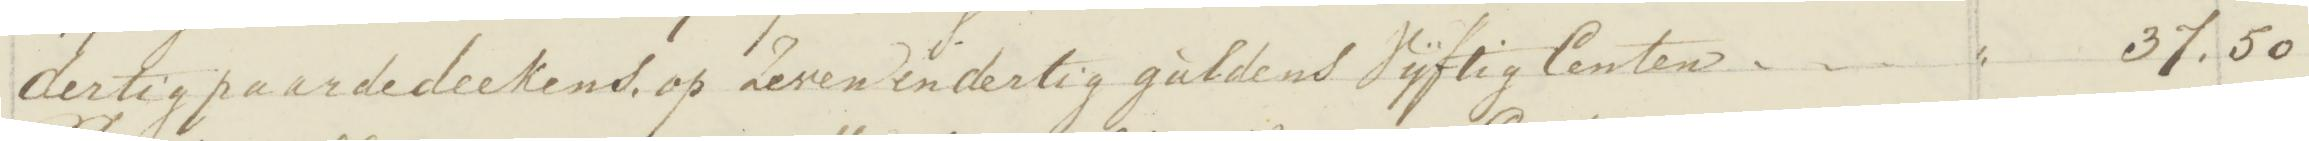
dertig paarde deekens, op zeven endertig guldens Vijftig Centen - - - „ 37. 50
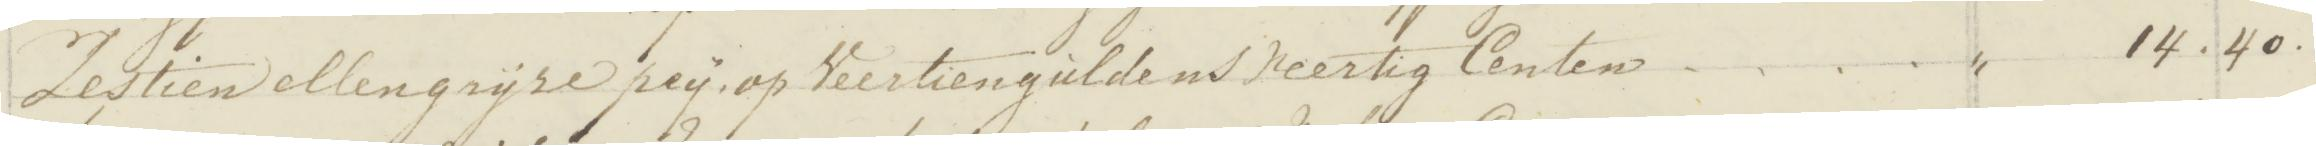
Zestien ellen grijze peij, op Veertien guldens Veertig Centen - - - - „ 14 .40.
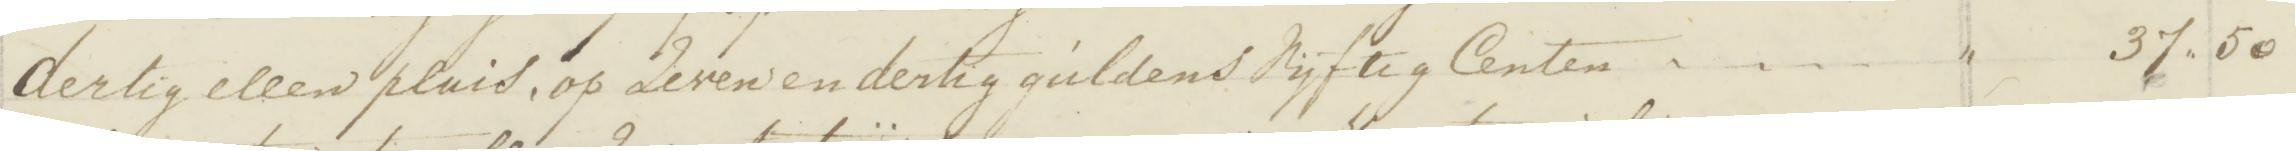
dertig ellen pluis, op Zeven en dertig guldens Vijftig Centen - - - - „ 37„ 50
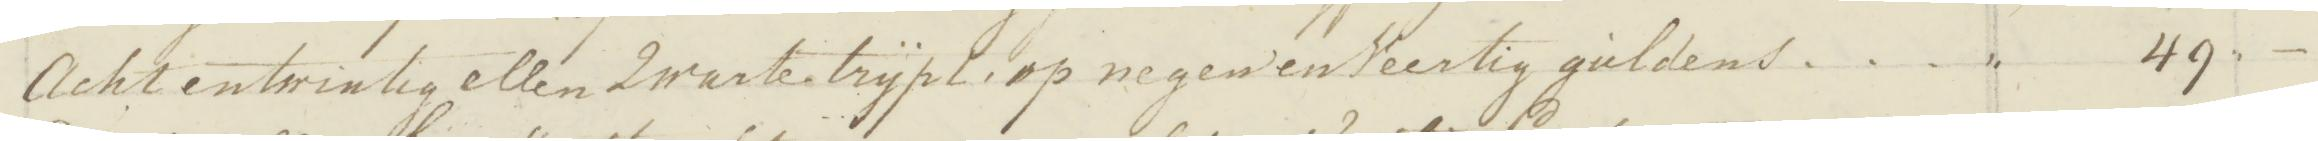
Acht entwintig ellen Zwarte trijpt, op negen en Veertig guldens - - - „ 49„ —
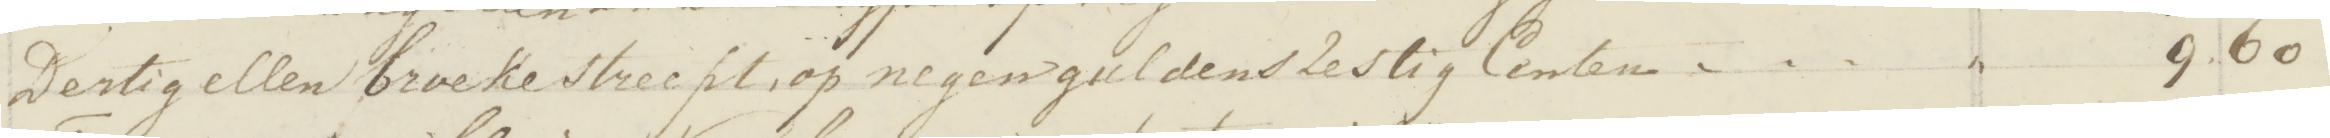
Dertig ellen broekestreept, op negen guldens zestig Centen - - - „ 9„60
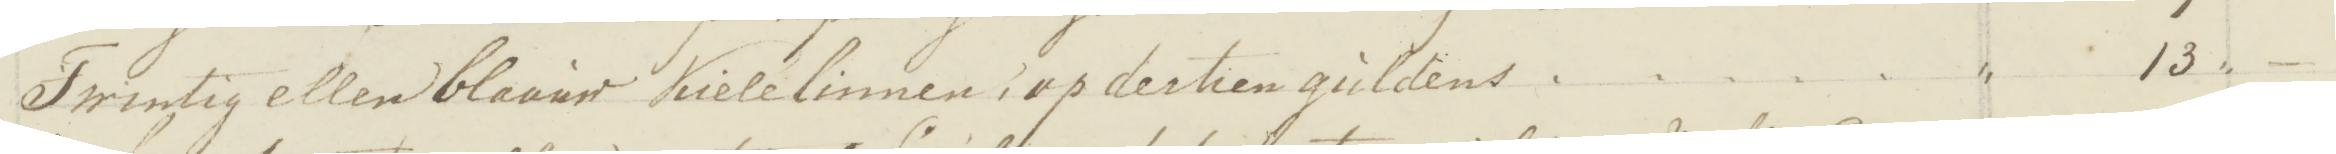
Twintig ellen blaauw Kielelinnen, op dertien guldens - - - - - „ 13 „ —
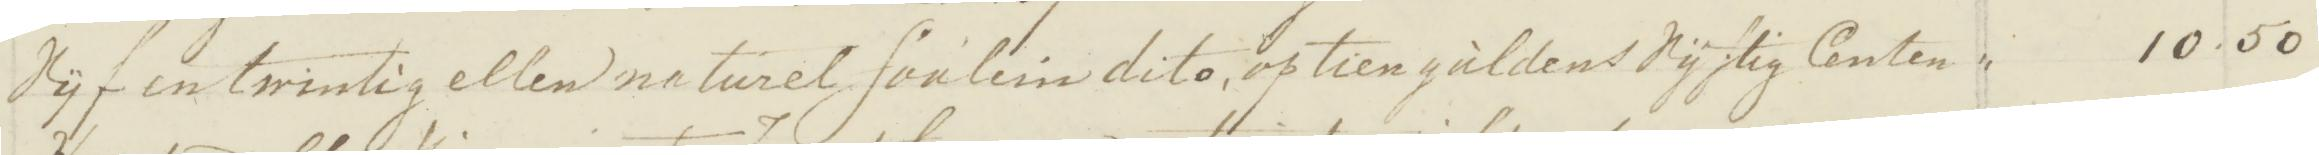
Vijf en twintig ellen naturel foulein dito, op tien guldens Vijftig Centen „ 10.50
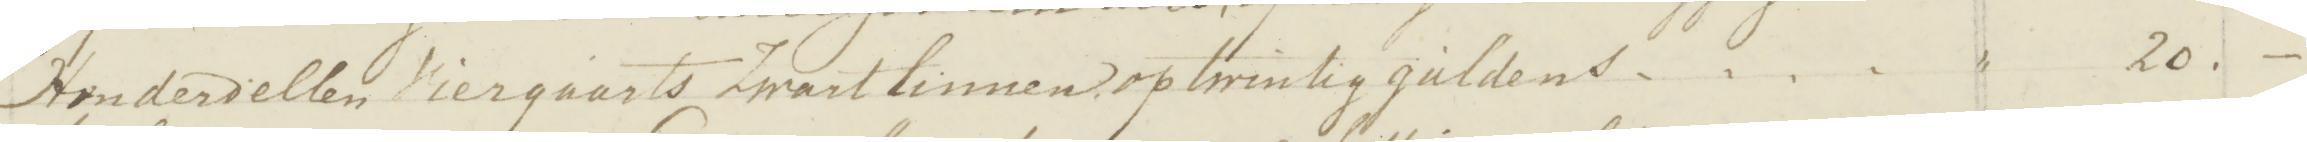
Honderd ellen Viergaarts Zwart linnen op twintig guldens - - - - „ 20. —
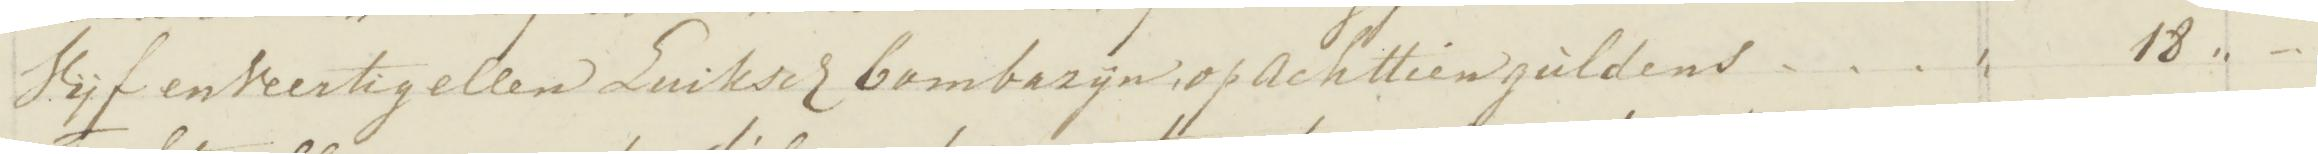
Vijf en Veertig ellen Luikser bombazijn, op achttien guldens - - - „ 18 „ —
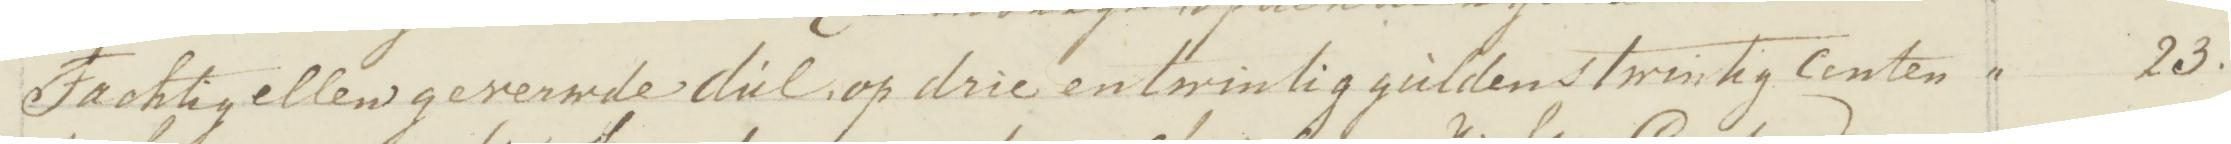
Tachtig ellen geverwde dul, op drie entwintig guldens twintig centen „ 23. 20
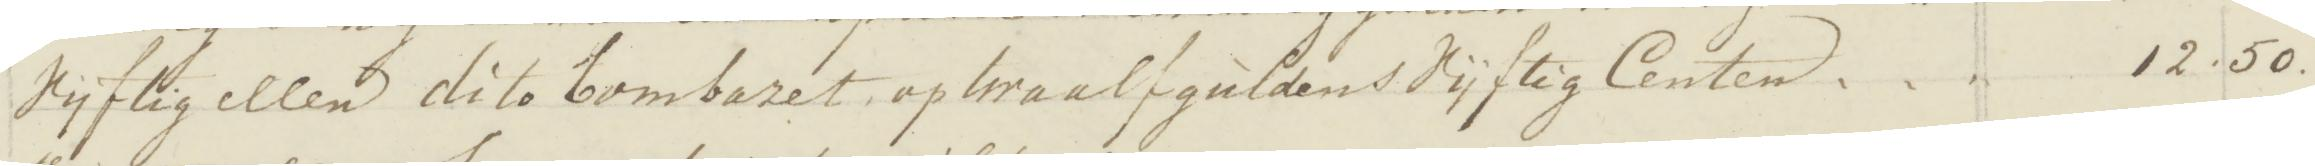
Vijftig ellen dito bombazet op twaalf guldens Vijftig Centen - - „ 12.50.
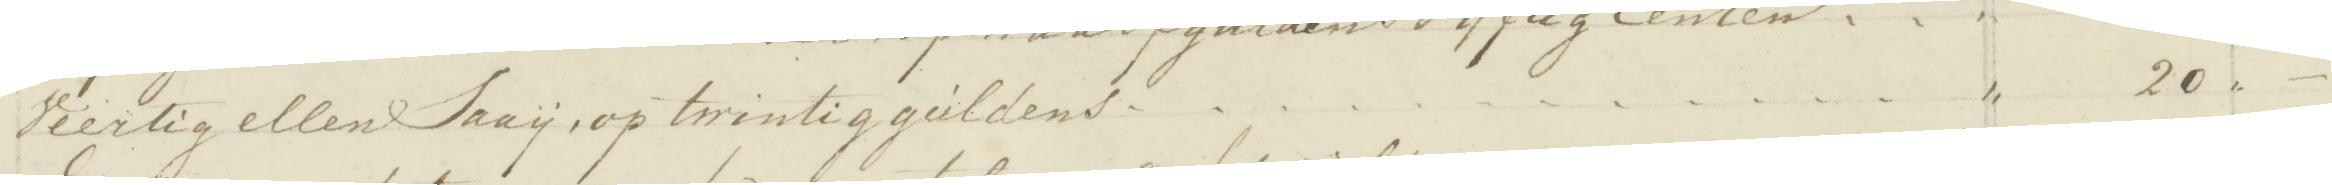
Veertig ellen Saaij, op twintig guldens - - - - - - - - - - „ 20 „ —
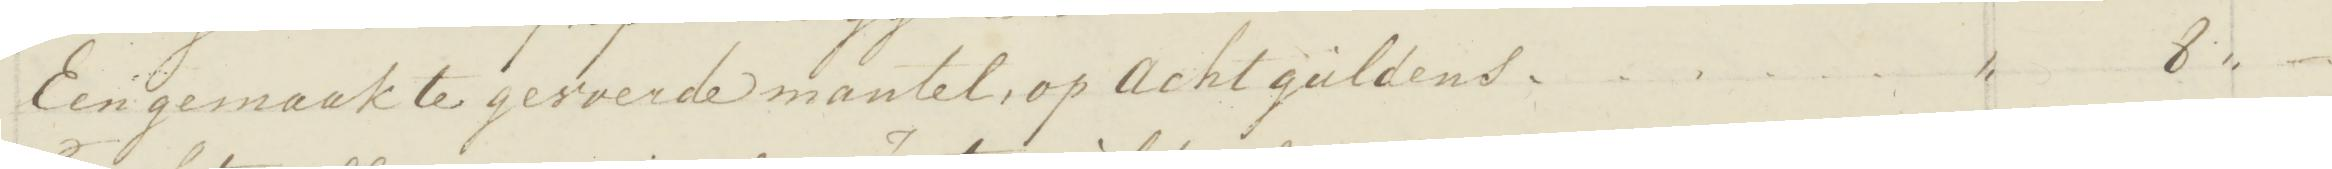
Een gemaakte gevoerde mantel, op acht guldens - - - - - - „ 8 „ —
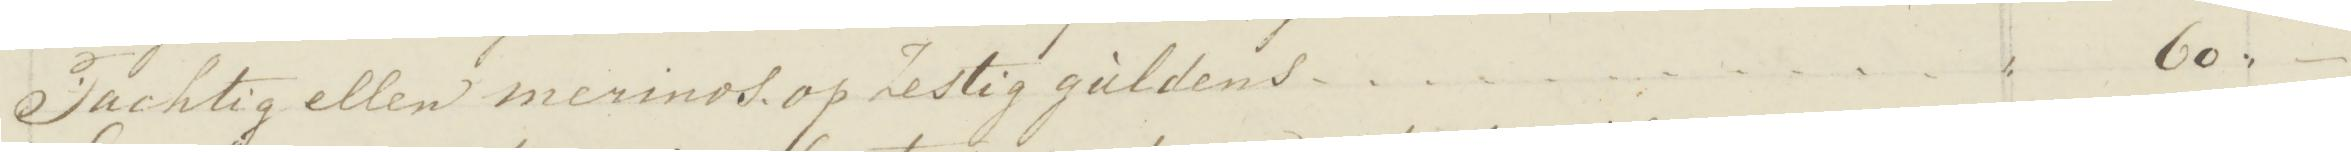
Tachtig ellen merinos. op Zestig guldens - - - - - - - - - - - „ 60 „ —
